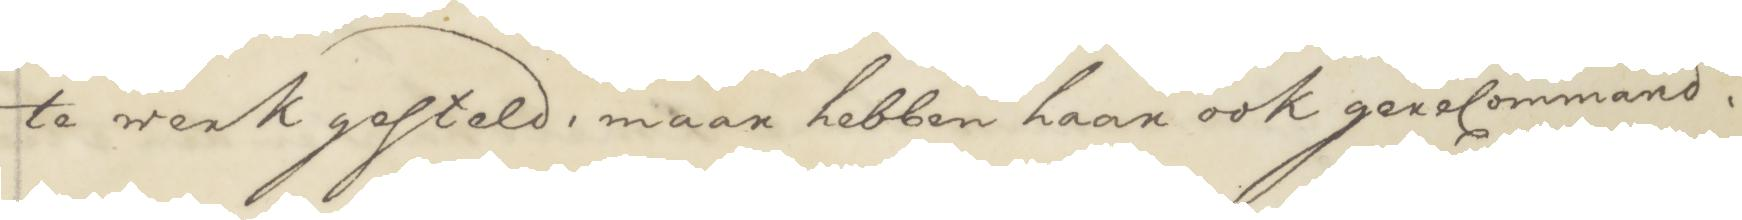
te werk gesteld, maar hebben haar ook gerecommand„
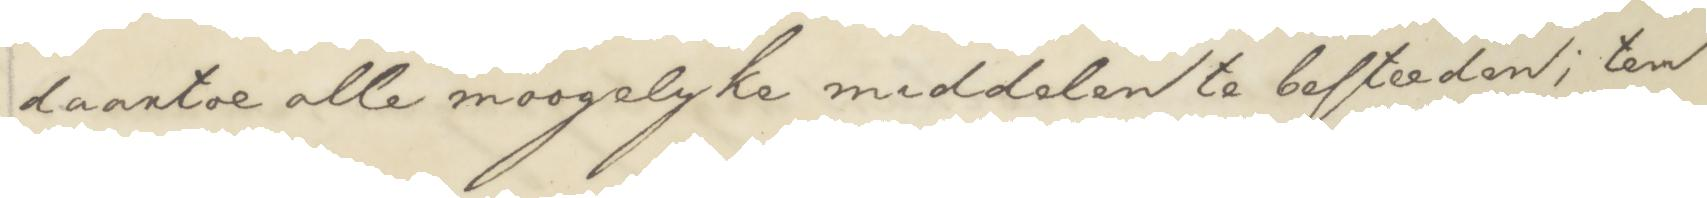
daartoe alle moogelyke middelen te besteeden; ten
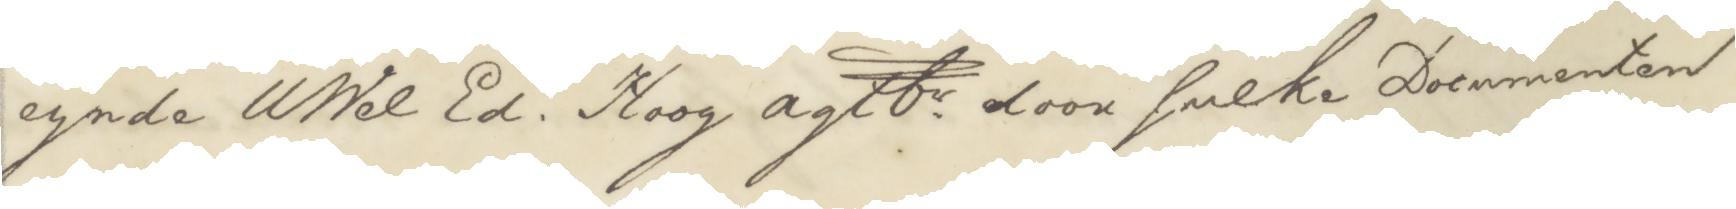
eynde UWel Ed: Hoog agtb:r door sulke Documenten
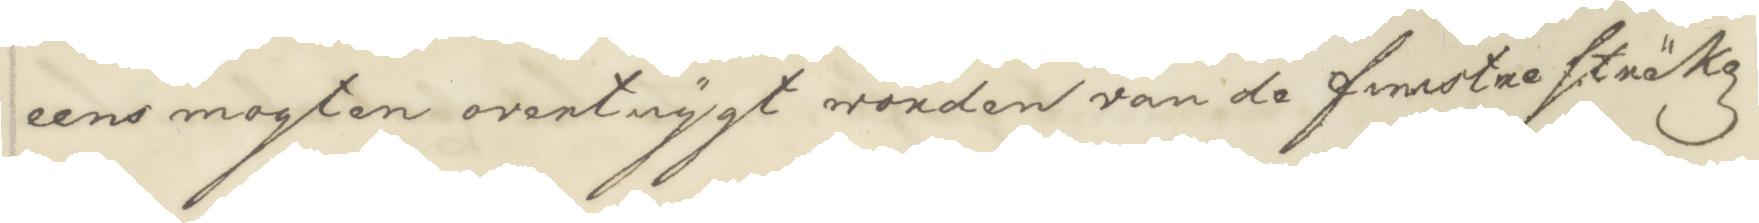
eens mogten overtuijgt worden van de sinistere strëken
